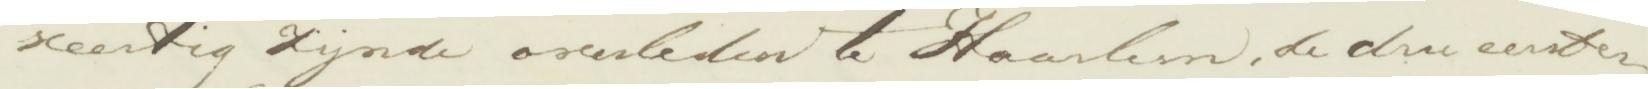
veertig zijnde overleden te Haarlem, de drie eersten
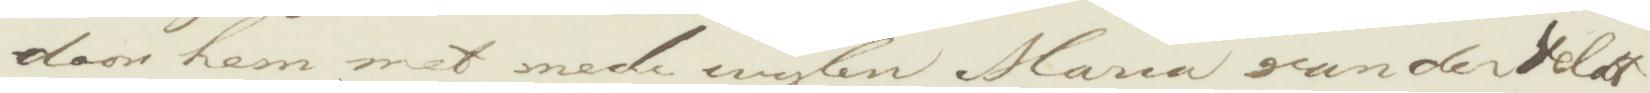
door hem met mede wylen Maria van der Velst
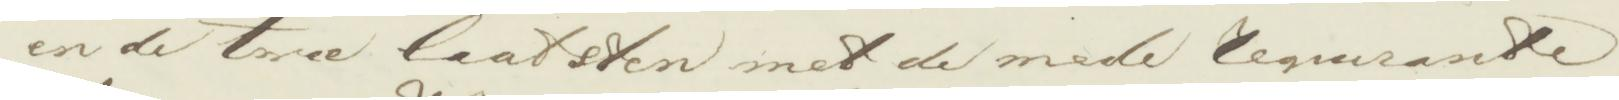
en de twee laatsten met de mede requirante
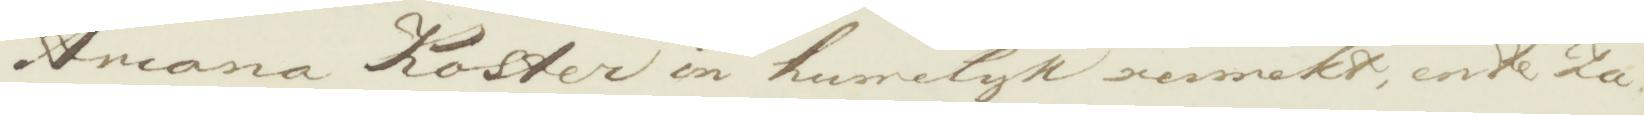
Ariana Koster in huwelyk verwekt, en te za
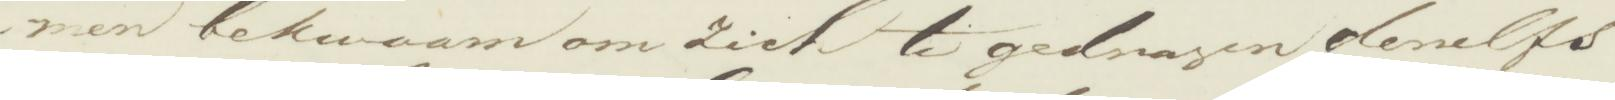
men bekwaam om zich te gedragen deszelfs
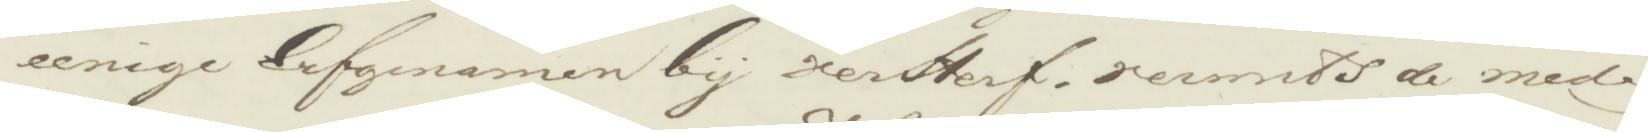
eenige Erfgenamen bij versterf, vermits de mede
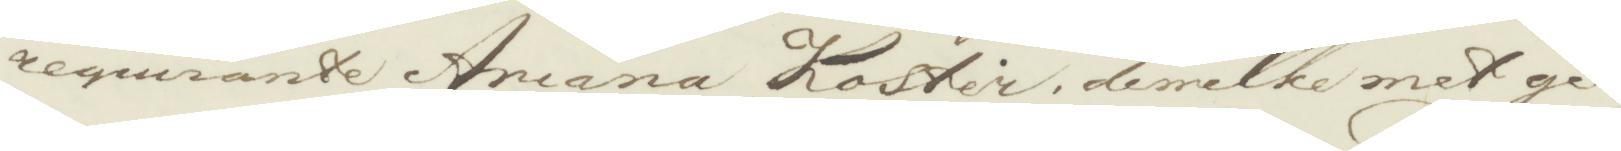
requirante Ariana Koster, dewelke met ge
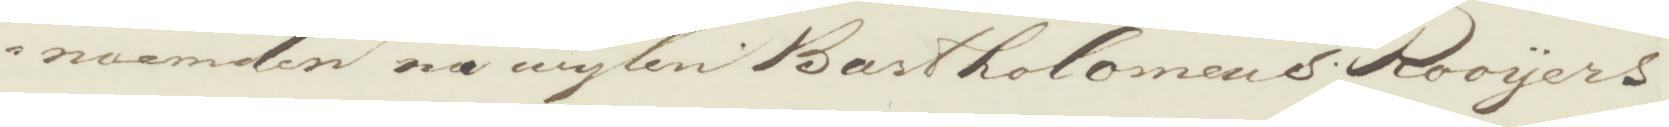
„noemden nu wylen Bartholomeus Rooijers
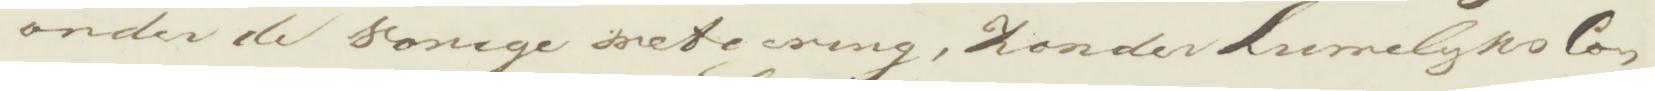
onder de vorige wetgeving, zonder huwelyks Con
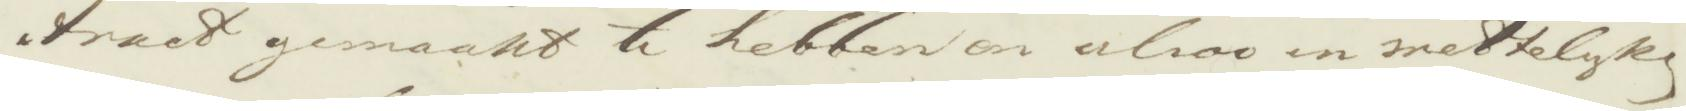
„tract gemaakt te hebben en alzoo in wettelyken
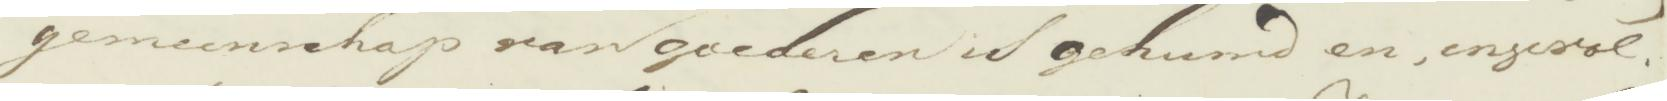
gemeenschap van goederen is gehuwd en, ingevol„
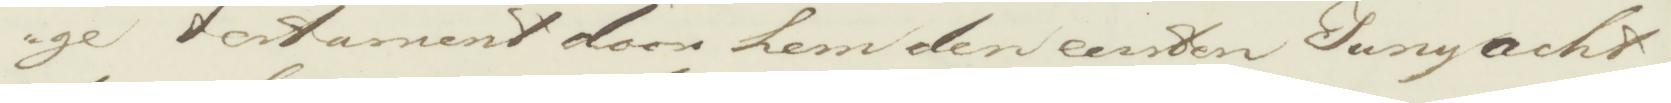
„ge testament door hem den eersten Iuny acht.
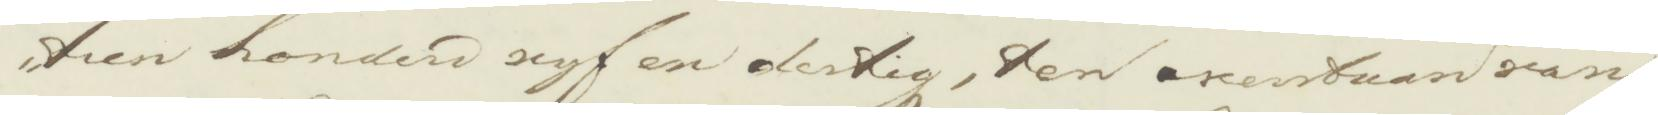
„tien honderd vyf en dertig, ten overstaan van
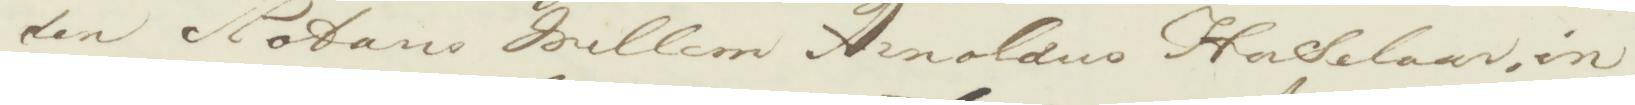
den Notaris Willem Arnoldus Haselaar, in
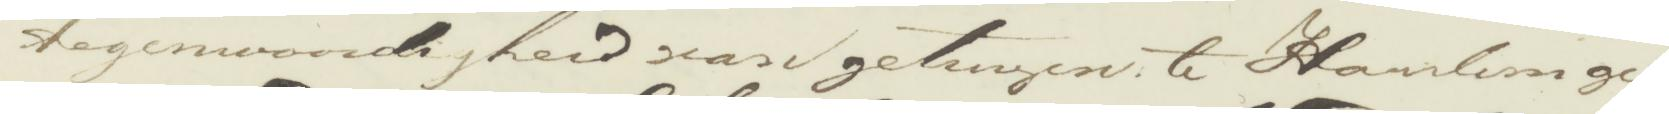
tegenwoordigheid van getuigen, te Haarlem ge.
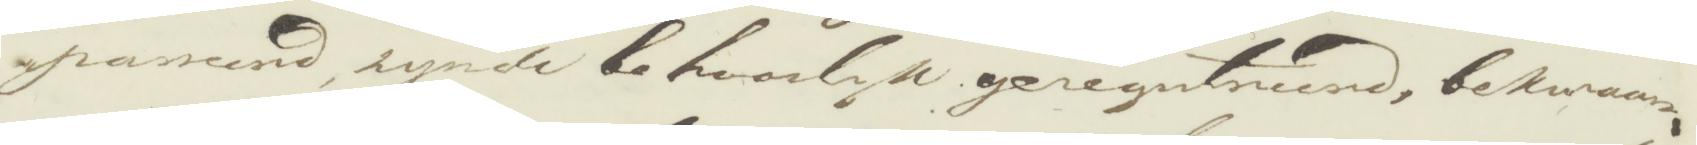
passeerd, zynde behoorlyk, geregistreerd, bekwaam
